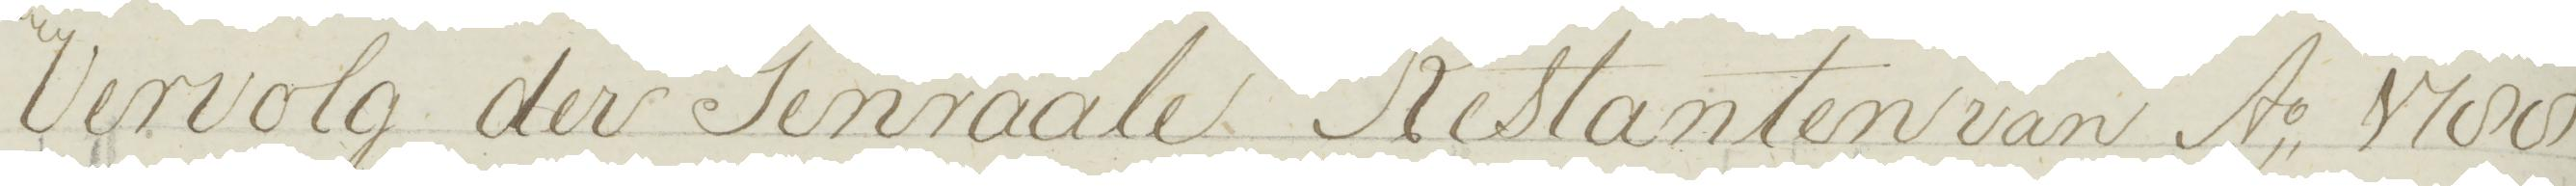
Vervolg der Genraale Restanten van A„o 1788
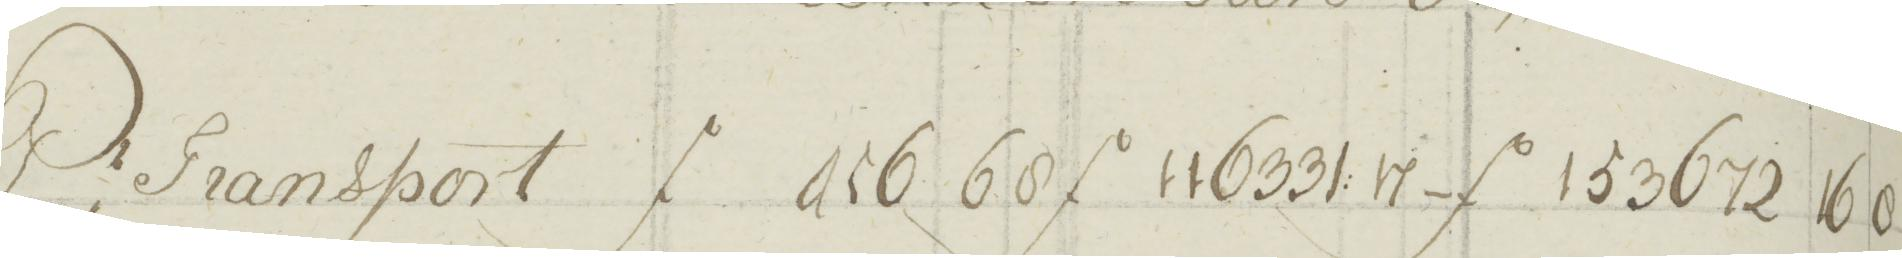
P,r Transport ƒ 456 6 8 ƒ 116331:17-ƒ 153672 168
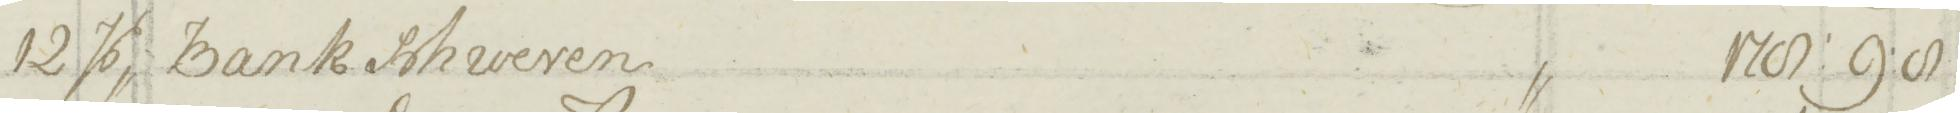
12 p„s Bank schroeven „ 178:9:8
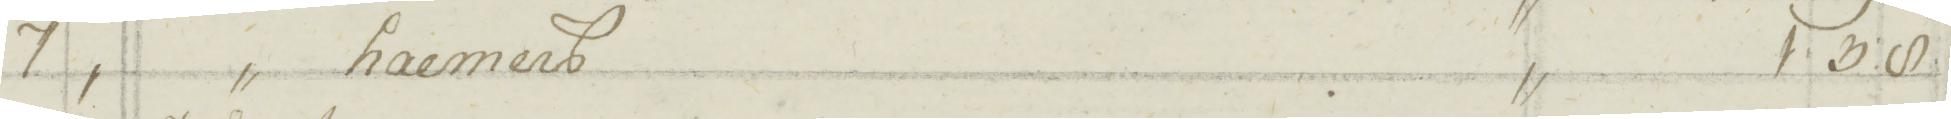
7 „ „ haemers „ 1:3:8:
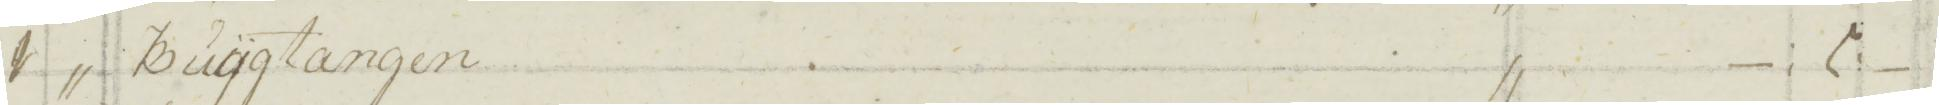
1 „ Buijgtangen „ _:5:_
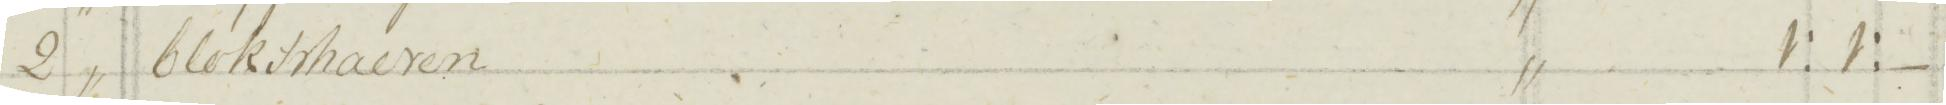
2 „ blokschaeven „ 1:1:_
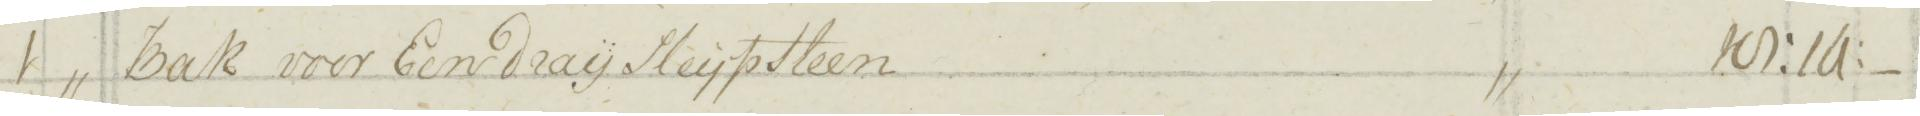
1 „ Bak voor Een draij sleijpsteen „ 18:14:_
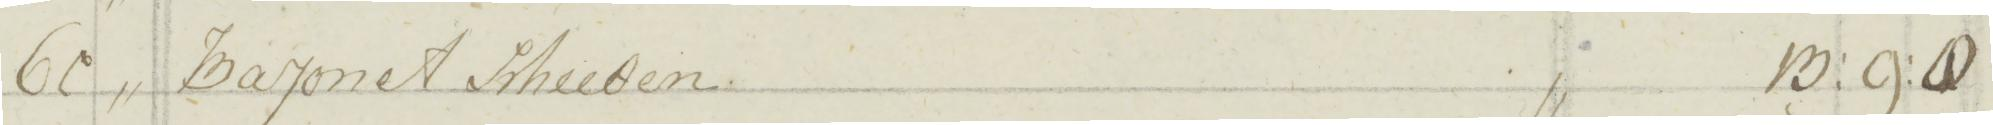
65 „ Bajonet scheeden „ 13:9:8
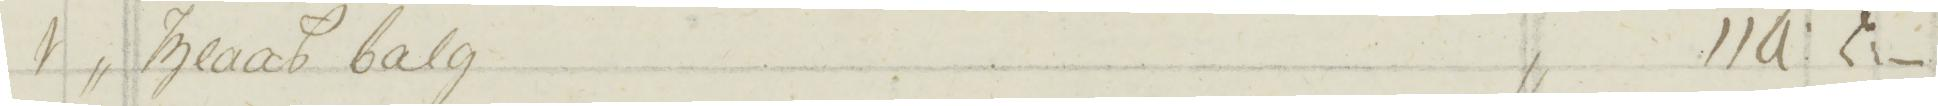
1 „ Blaas balg „ 114:5:_
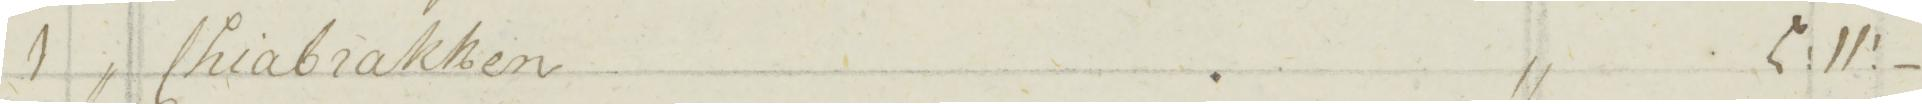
1 „ Chiabrakken „ 5:11:_
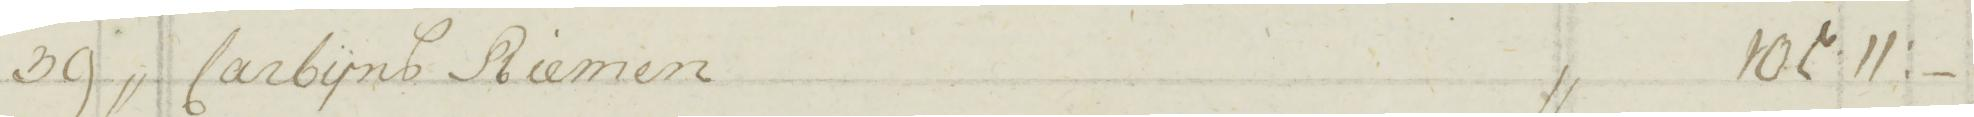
39 „ Carbijns Riemen „ 105:11:_
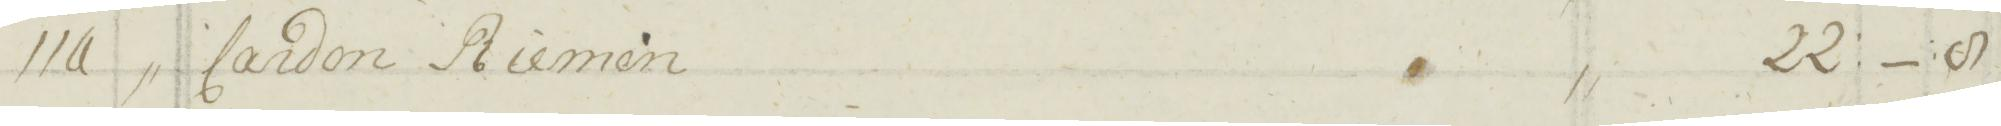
114 „ Cardon Riemen „ 22:_:8
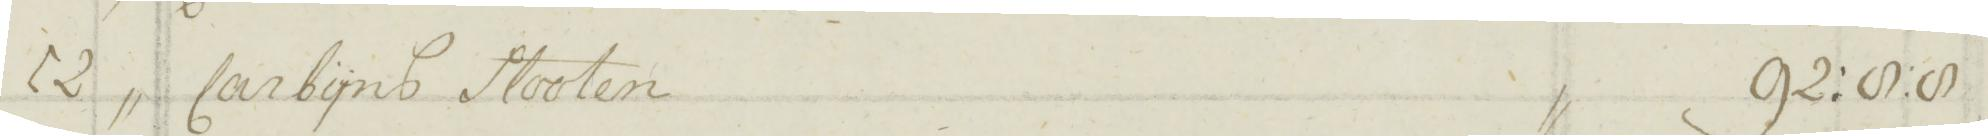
52 „ Carbijns slooten „ 92:8:8
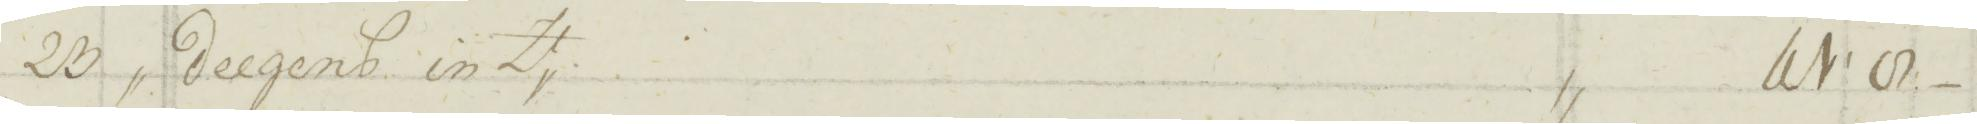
23 „ deegens in Z„t „ 41'8:_
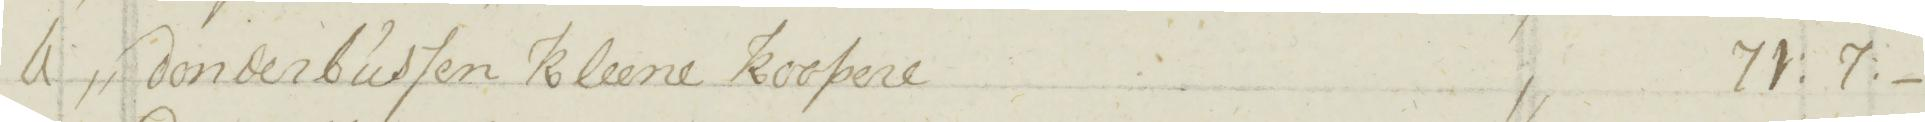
4 „ donder bussen kleene koopere „ 71:7:_
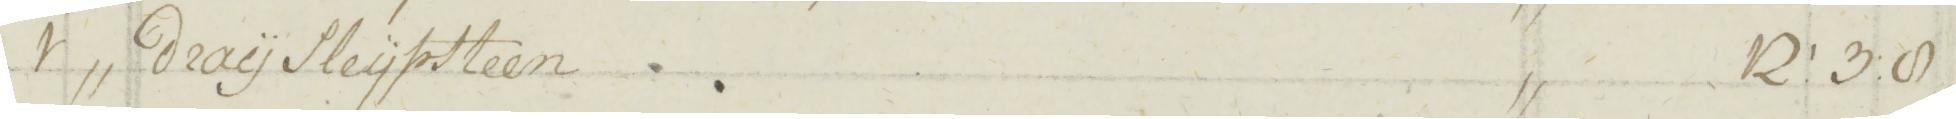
1 „ draij sleijpsteen „ 12:3:8
